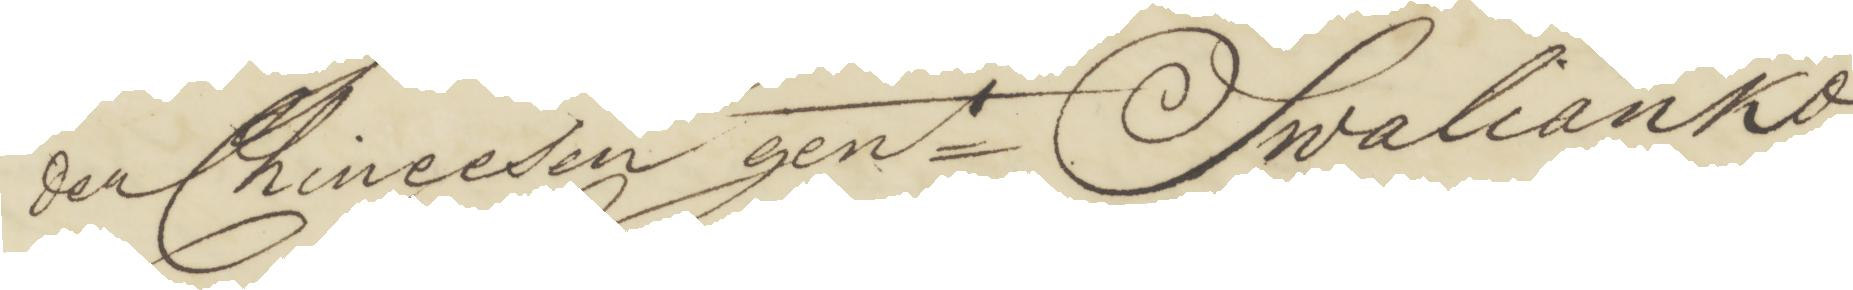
der Chineesen gen=t Swalianko
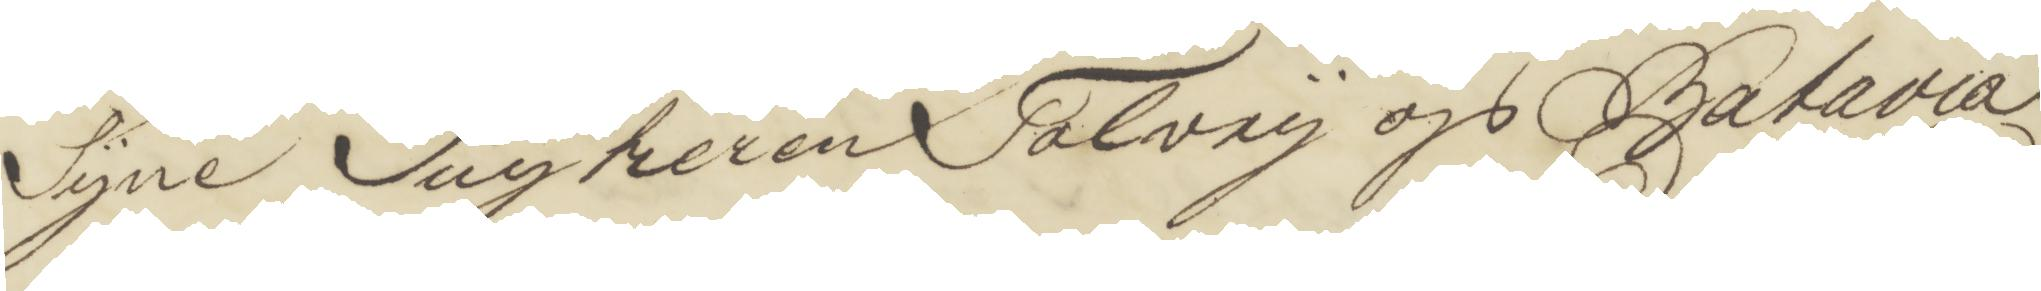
Sijne Suijkeren Tolvrij op Batavia
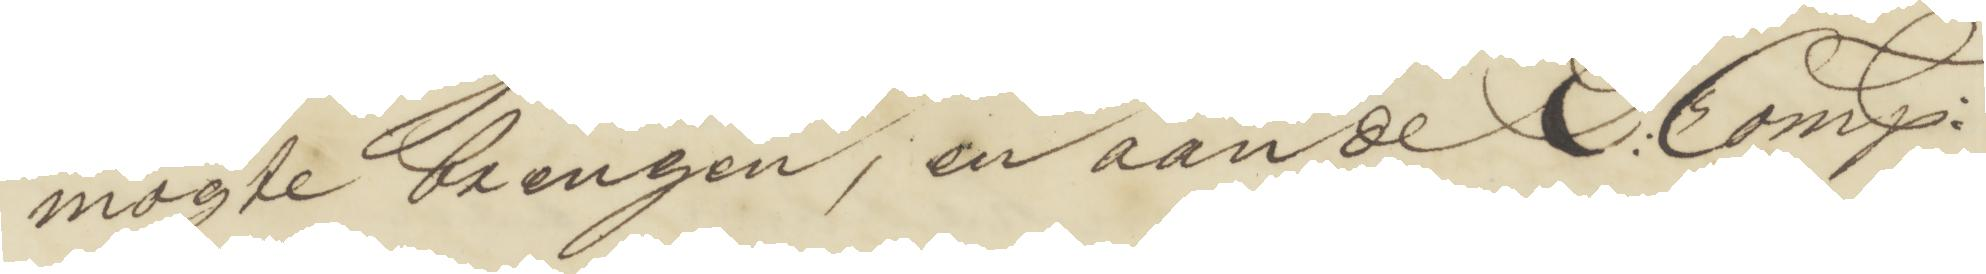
mogte brengen, en aan de E: Comp:
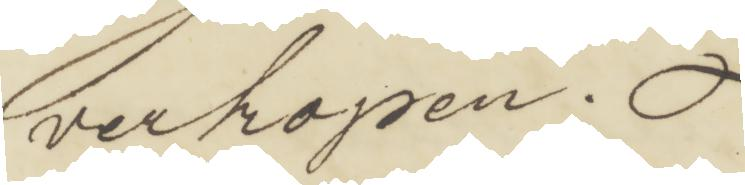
verkopen.
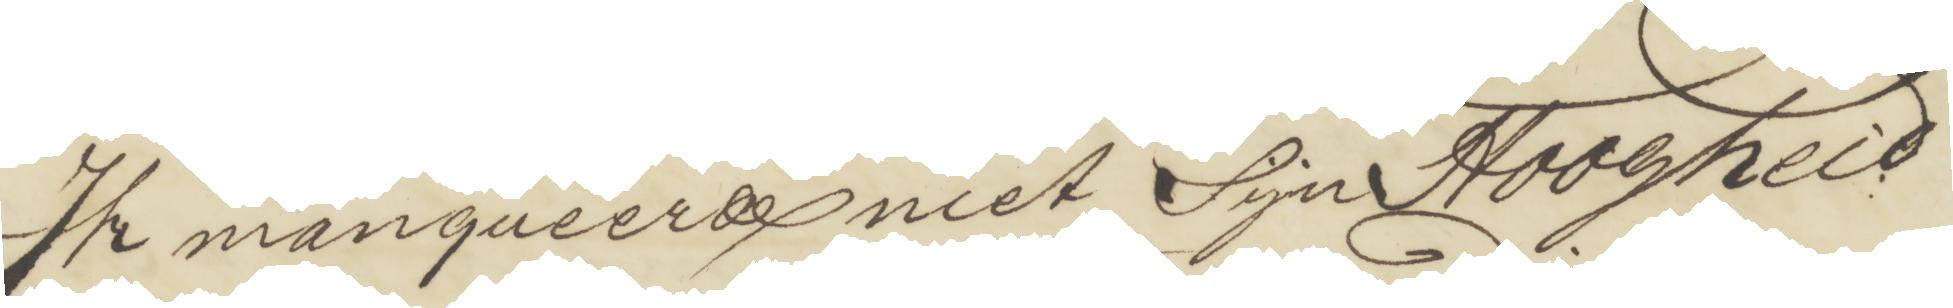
Ik manqueerde niet sijn Hoogheid
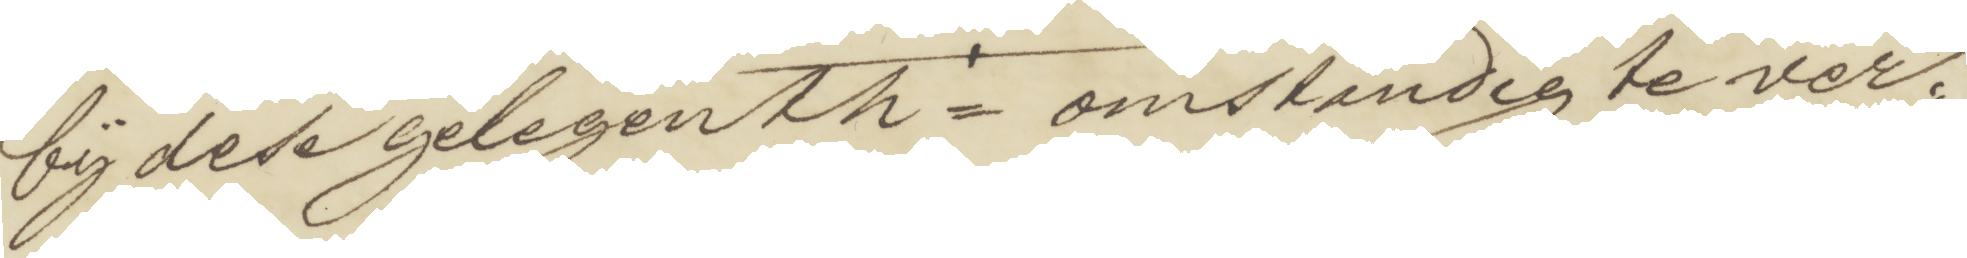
bij dese gelegenth=t omstandig te ver„
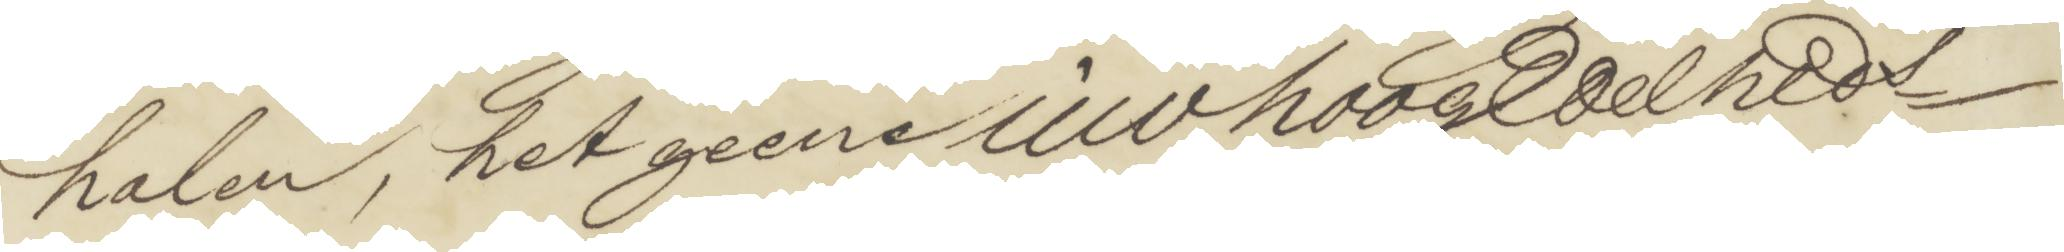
halen, het geene UW hoog Edelhed=s
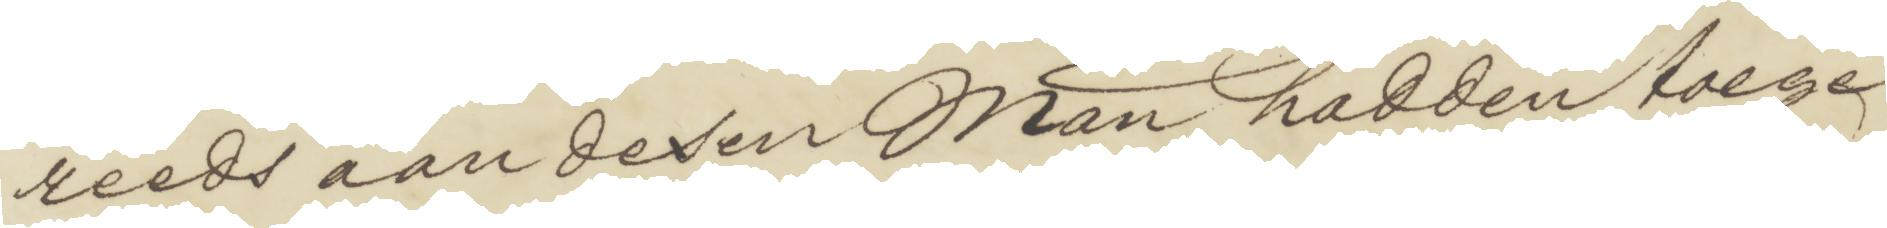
reeds aan desen Man hadden toege
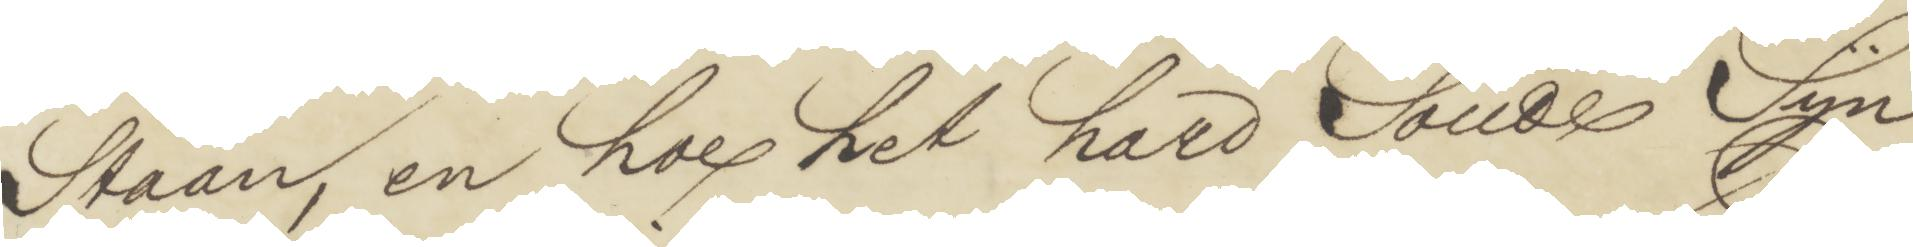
Staan, en hoe het hard Soude Sijn
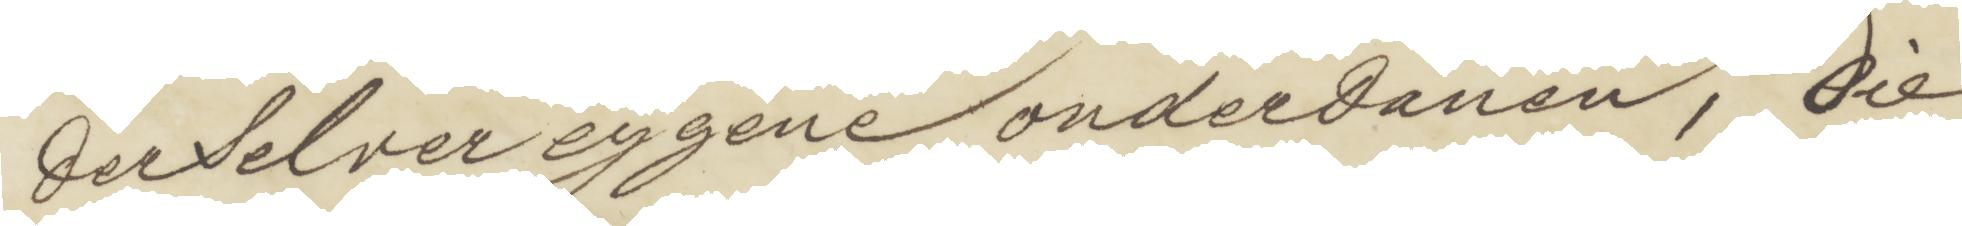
derselver eijgene onderdanen, die
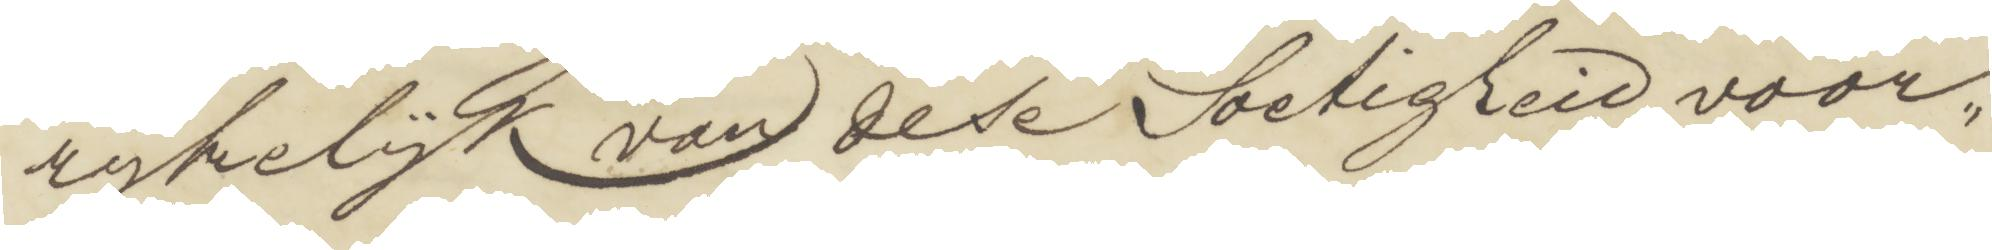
rijkelijk van dese Soetigheid voor„
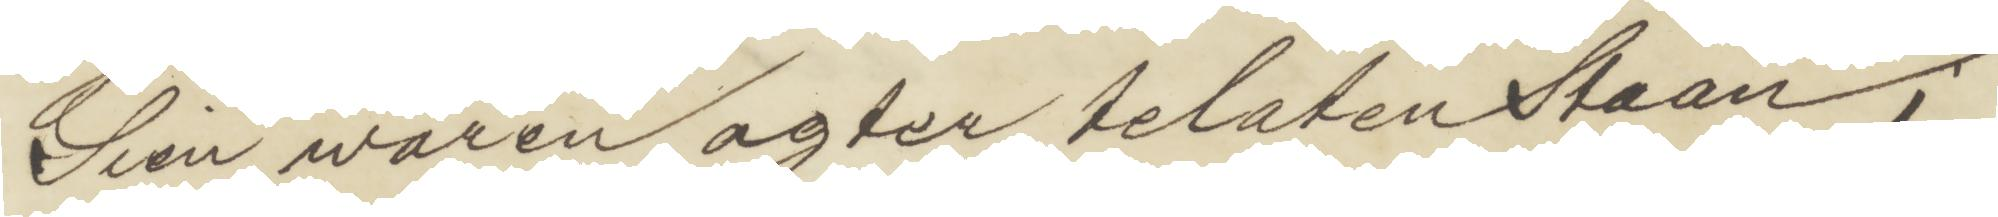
Sien waren agter telaten Staan;
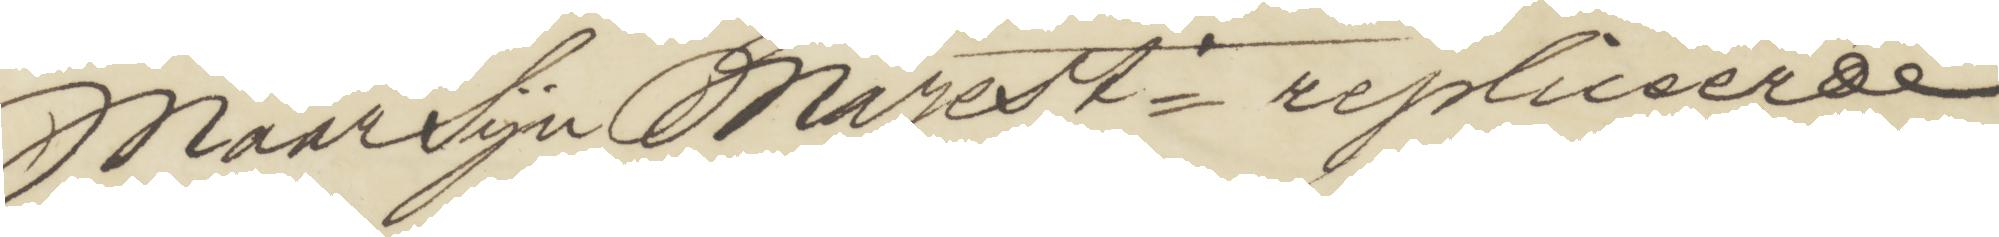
Maar Sijn Majest=t repliceerde
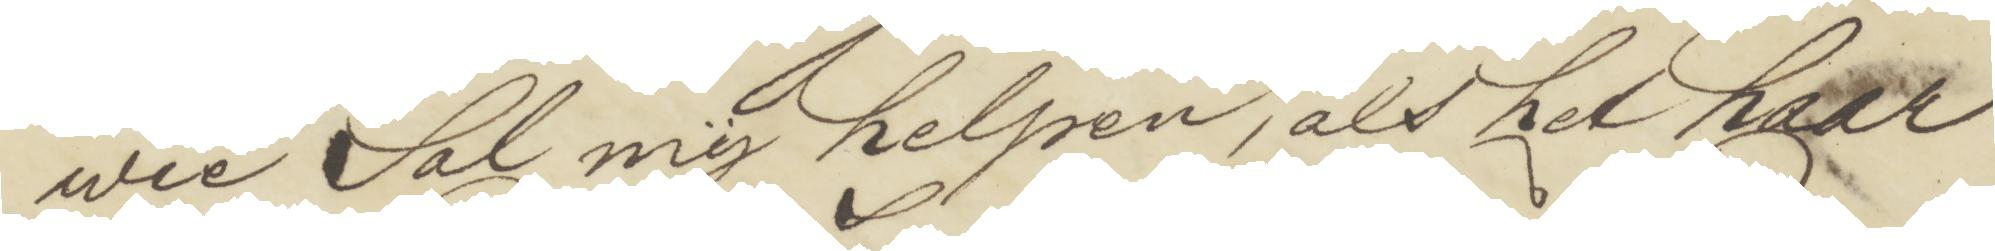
wie Sal mij helpen, als het haar
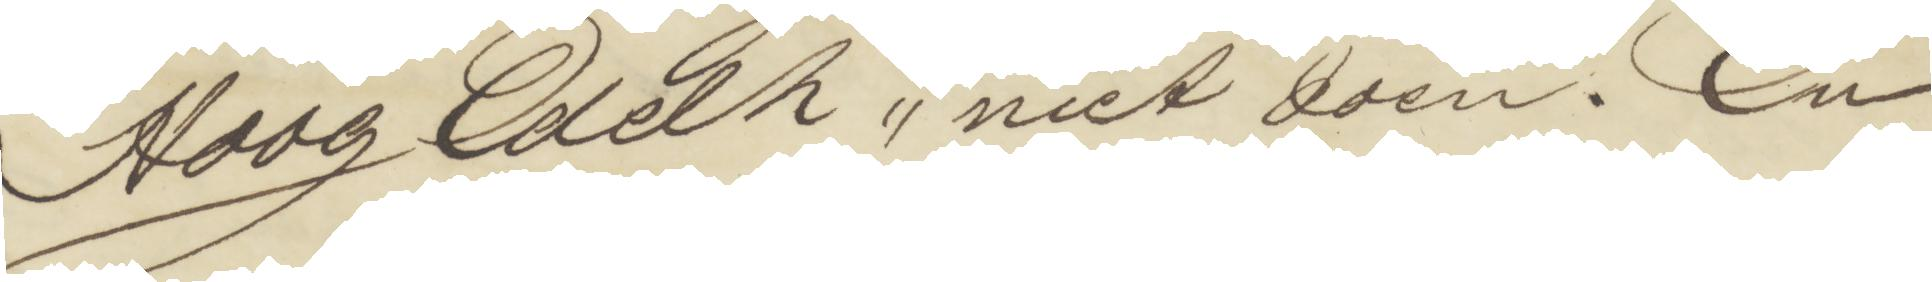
Hoog Edelh„s niet doen. En
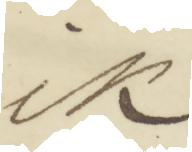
ik
